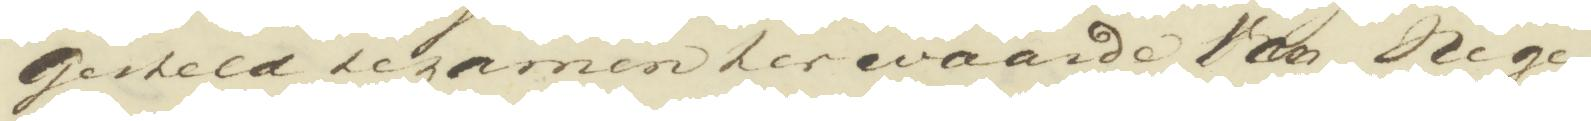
gesteld tezamen terwaarde Van Negen
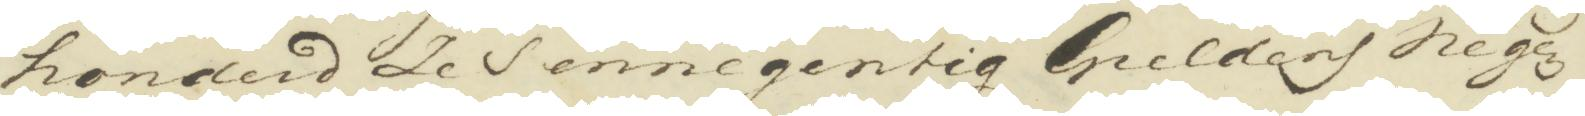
honderd Zes en negentig Guldens Negen
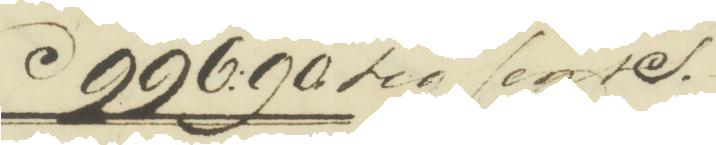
ƒ 996:90 tig Cents.
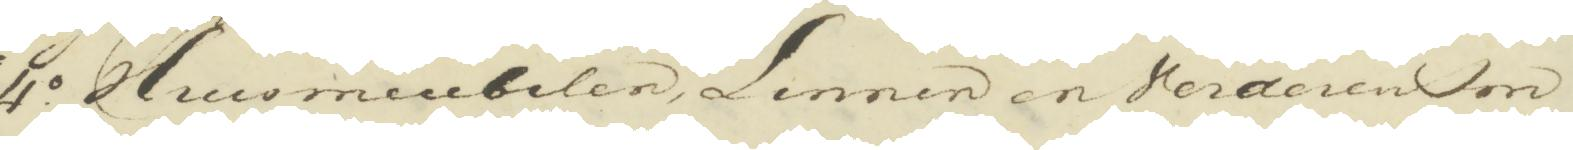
4.o Huismeubelen, Linnen en Verderen Ion
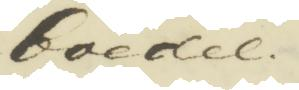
=boedel.
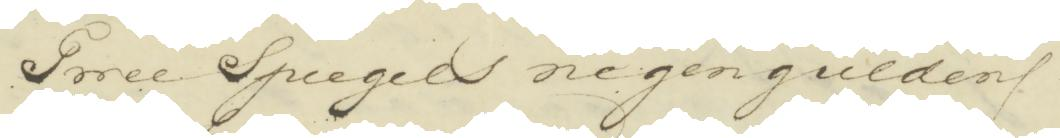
Twee spiegels negen guldens
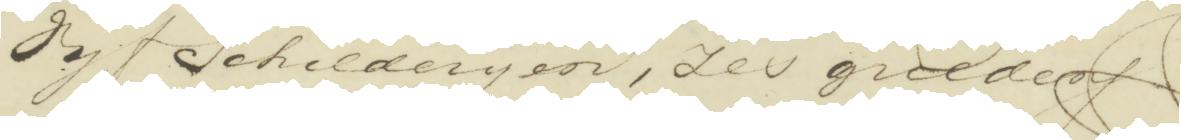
Vyf schilderijen, zes guldens
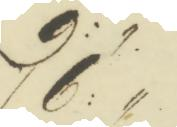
ƒ 6: „
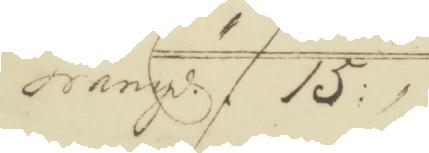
Transp.e ƒ 15:„
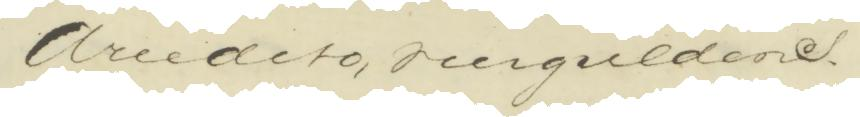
drie dito, vierguldens.
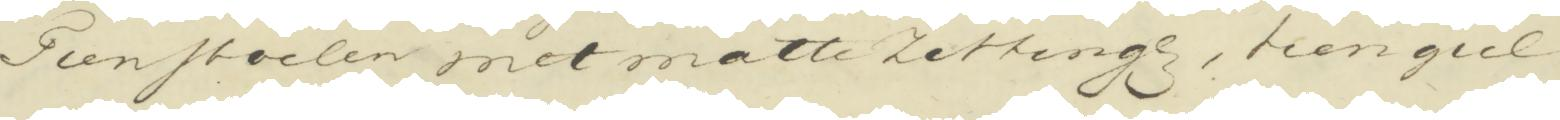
Tien stoelen met matte zittingen, tien gul
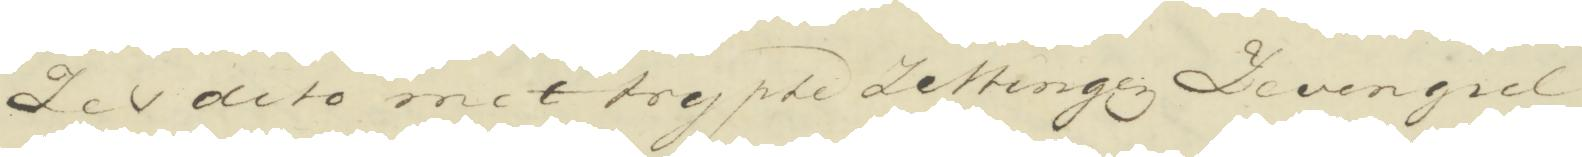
Zes dito met trypte zittingen Zeven gul
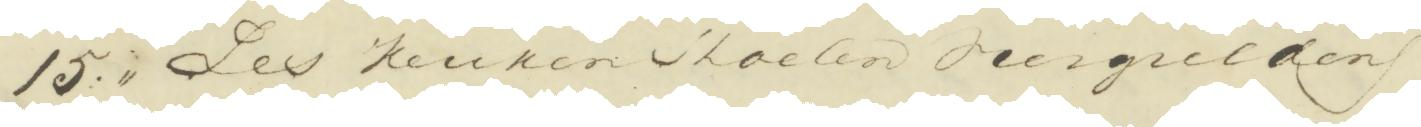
15.„ Zes keuken stoelen Vierguldens
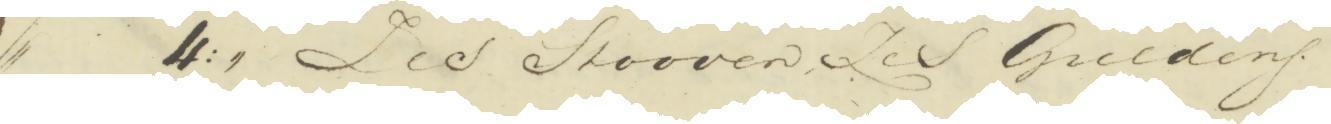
„ 4:„ Zes stooven, Zes Guldens.
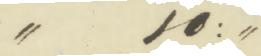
„ 10: „
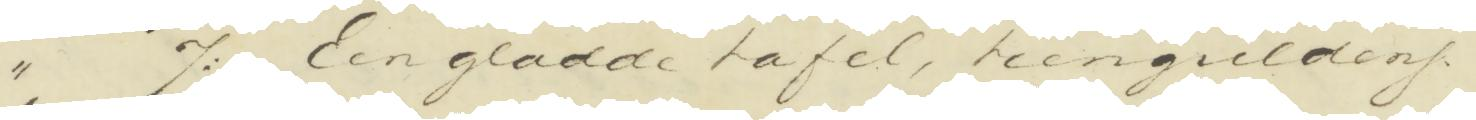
„ 7:„ Een gladde tafel, tien guldens.
